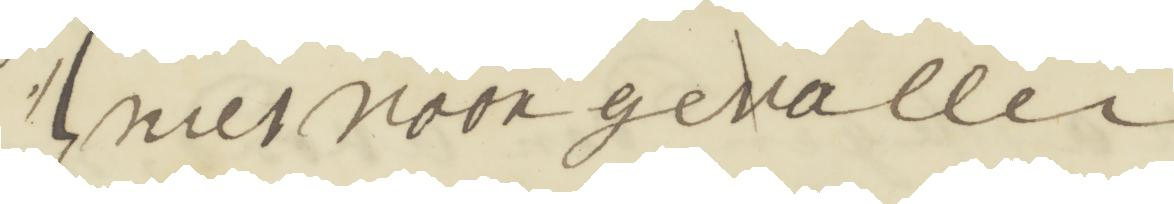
niet voor gevallen
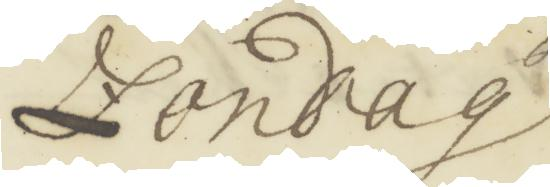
Zondag „ 3:'
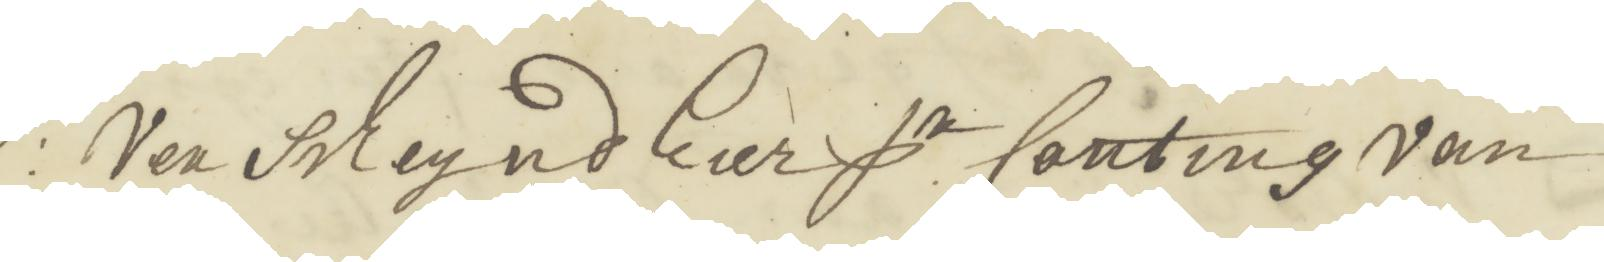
„ 4 d:o verscheynd hier pr Conting van
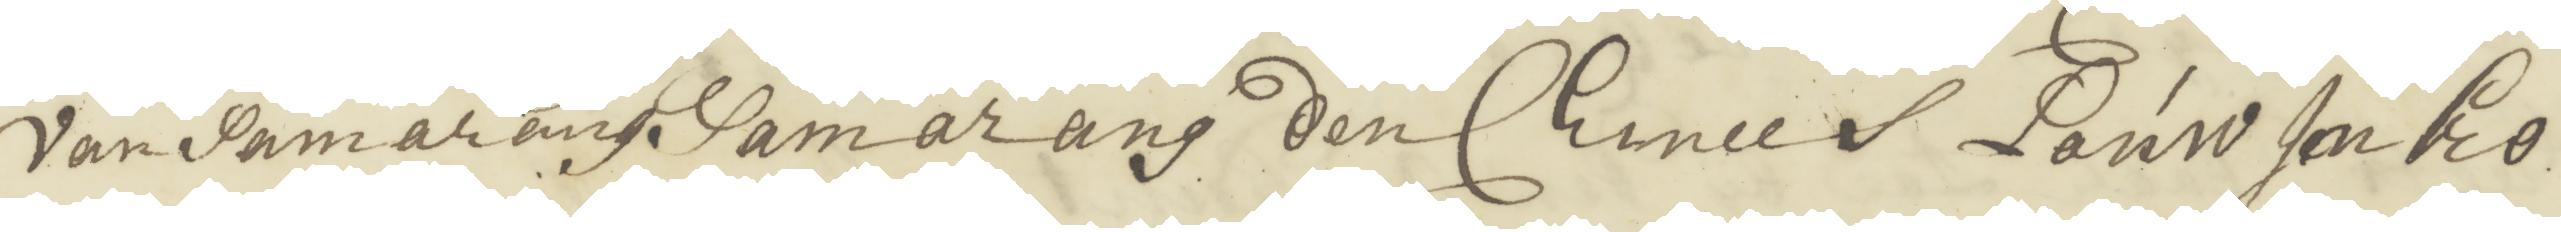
van Samarang. Samarang den Chinees Lauw Jnko
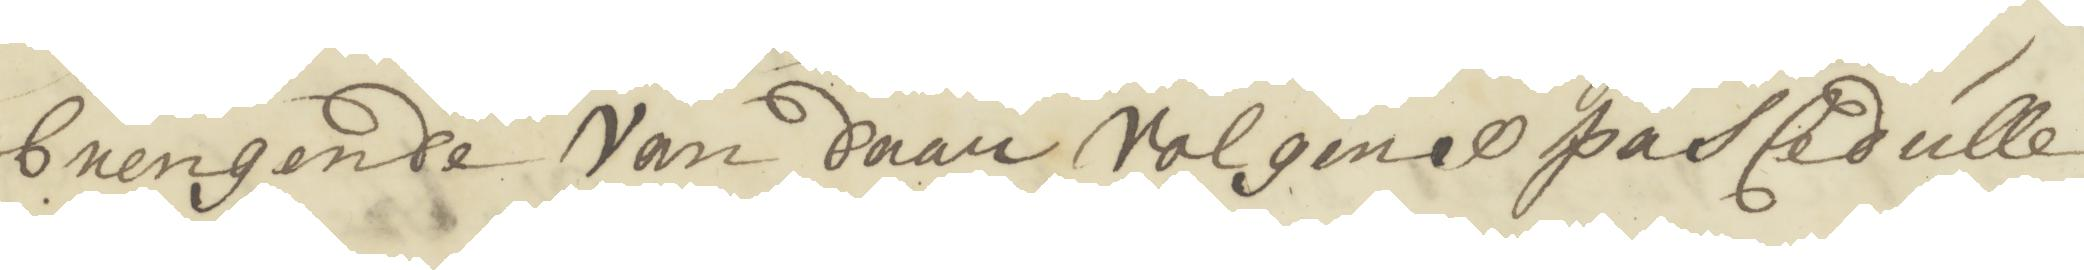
brengende van daan volgens pas cedulle
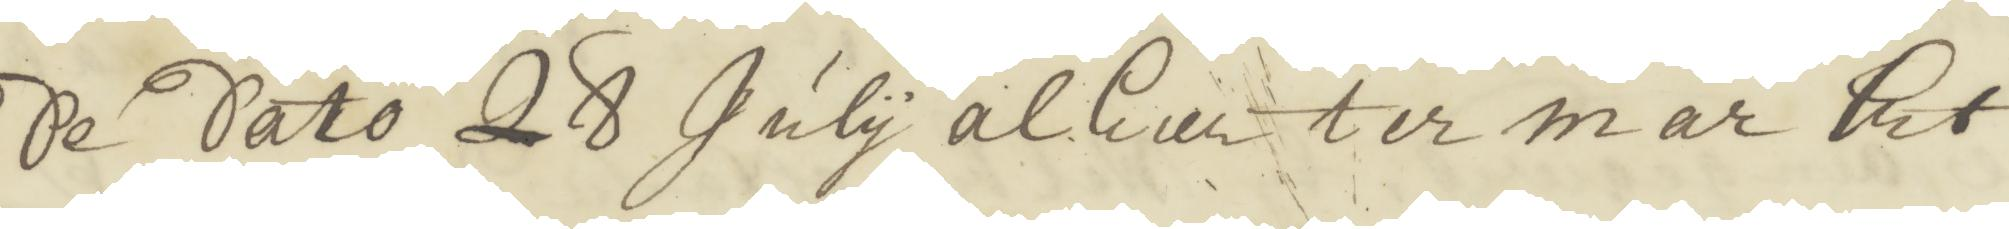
de dato 28 Julij alhier ter markt
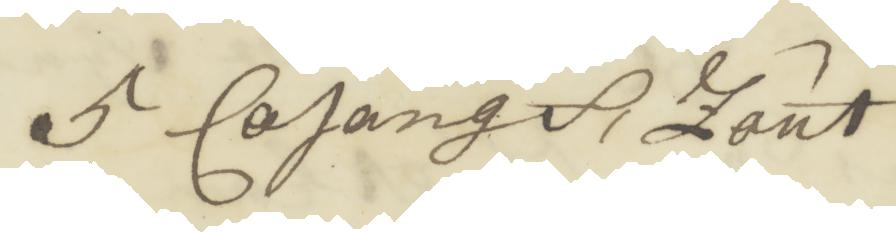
5 Cajangs, Zout
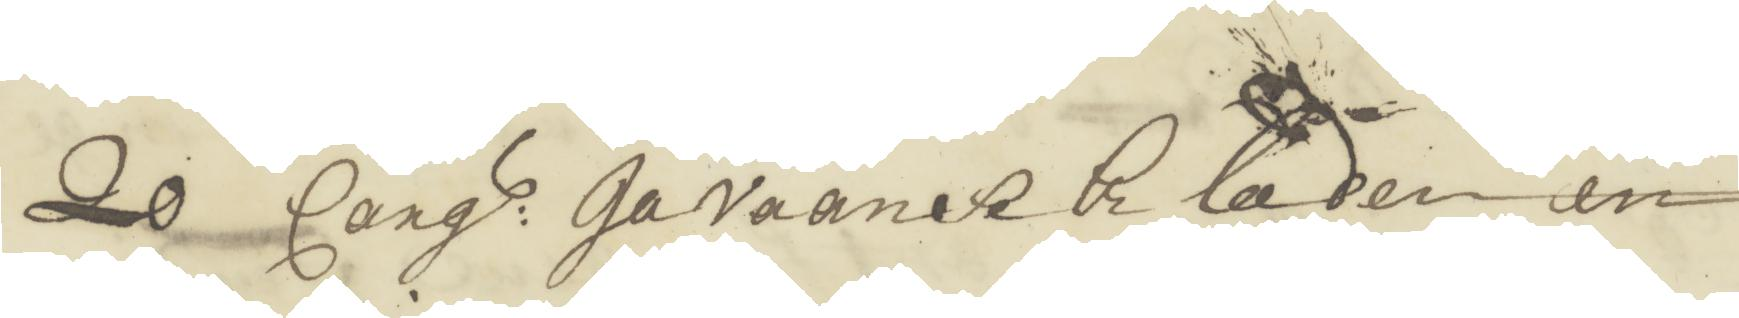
20 Cang:s Javaanse kleeden en
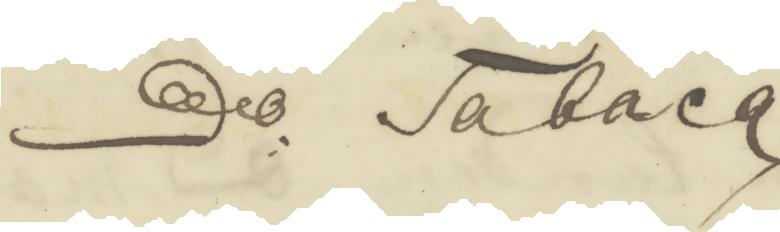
D:o tabacq
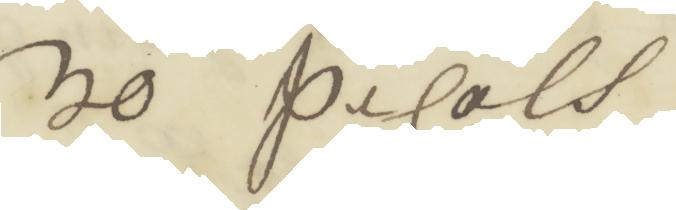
30 picals
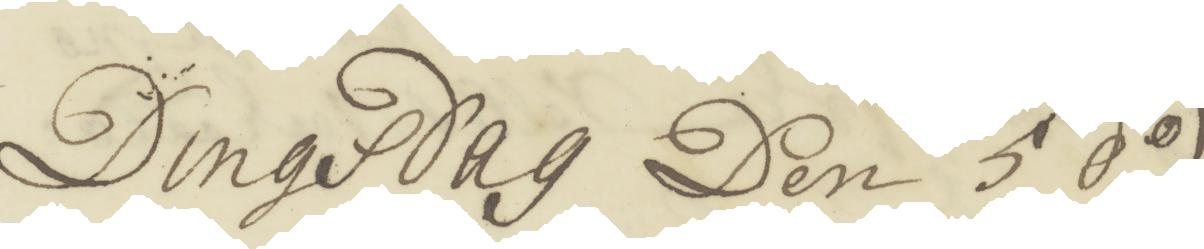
Dingsdag Den 5 do
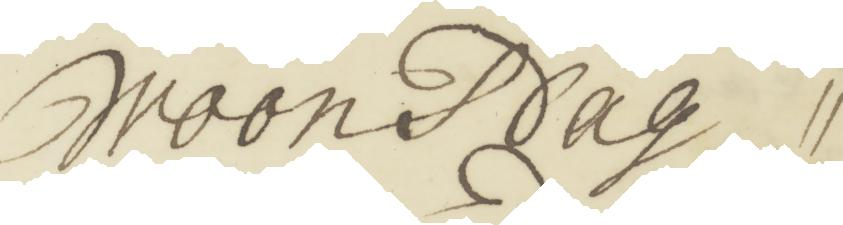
woonsdag „
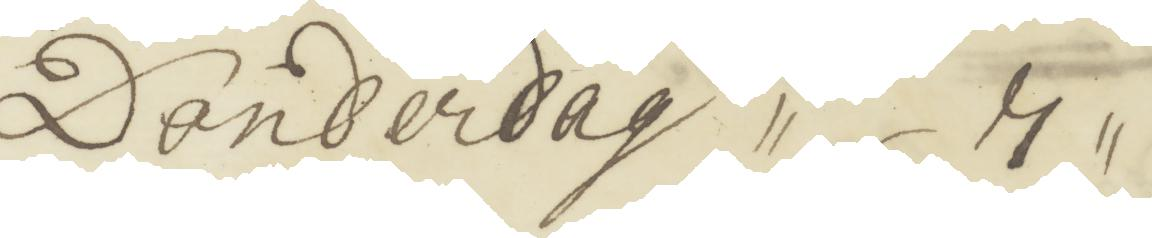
Donderdag „ 7 „
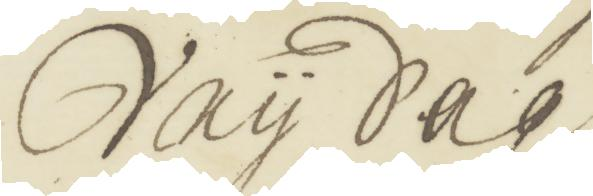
Vrijdag
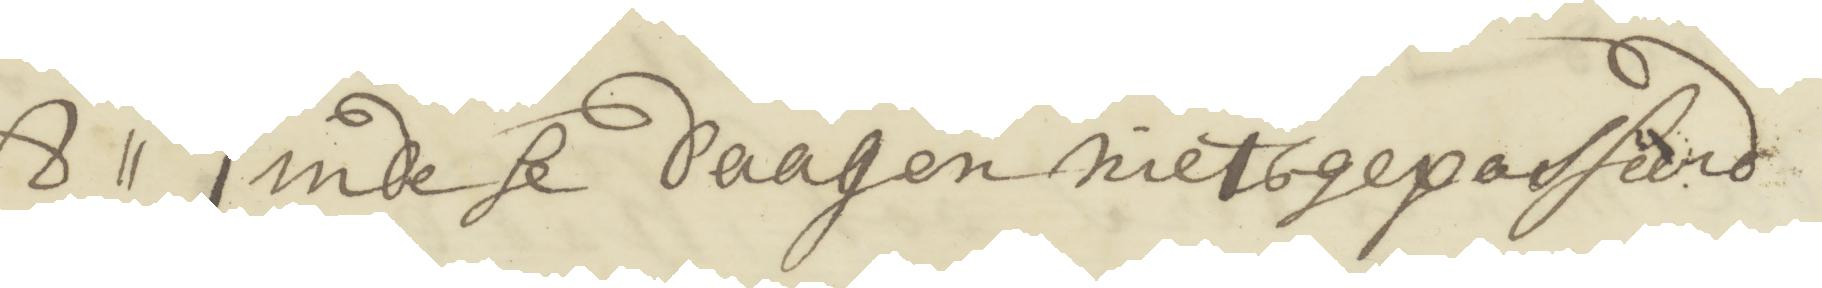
8 „ in dese daagen niets gepasseerd
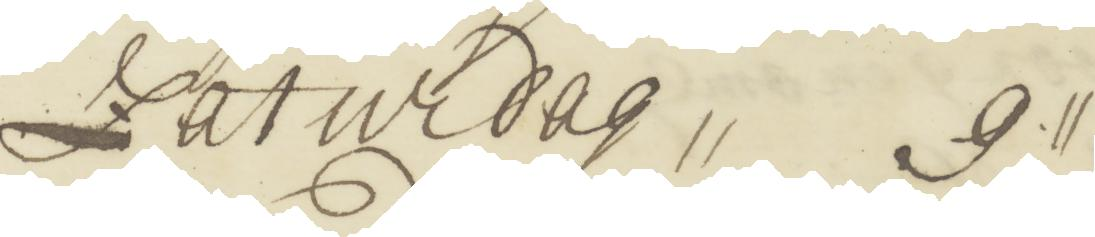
Zaturdag „ 9 „
